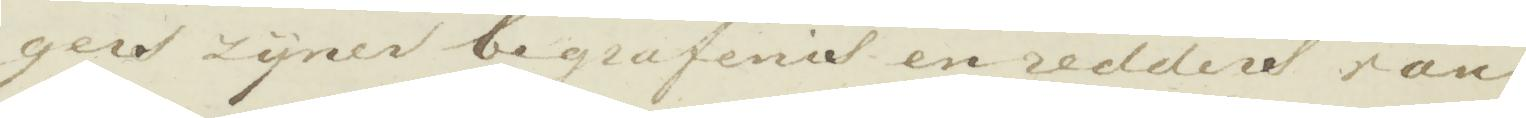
gers zijner begrafenis en redders van
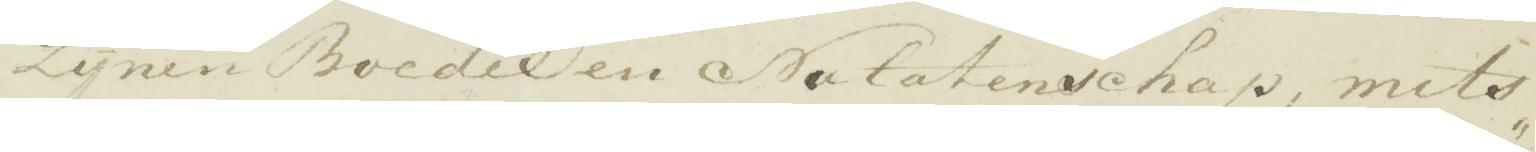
zijnen Boedel en Natatenschap, mits„
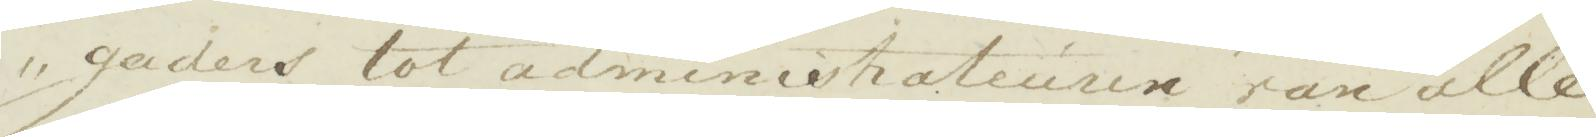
„gaders tot administrateuren van alle
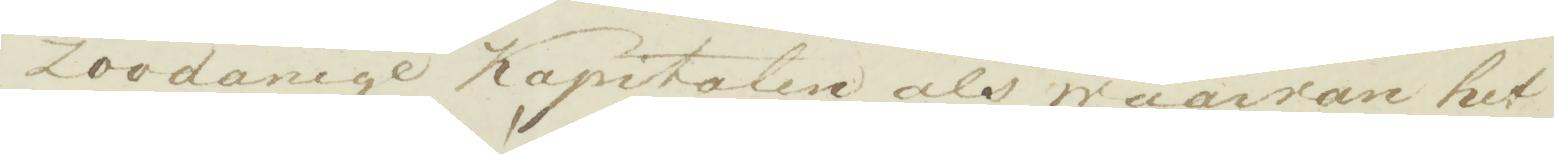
zoodanige Kapitalen als waarvan het
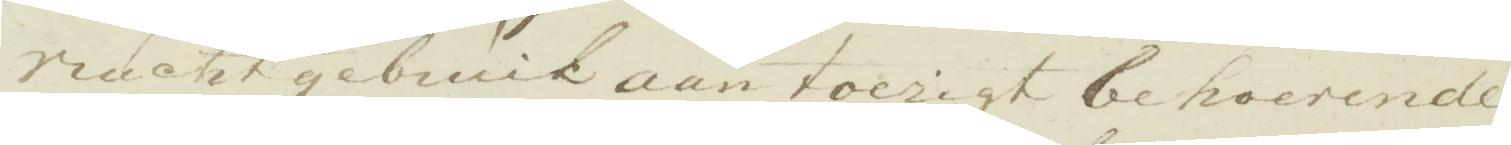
vruchtgebruik aan toezigt behoevende
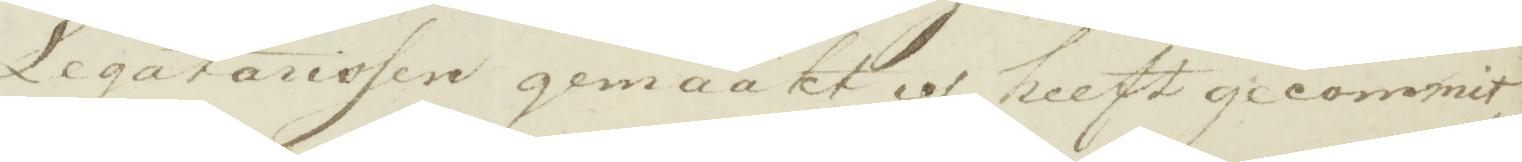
Legatarissen gemaakt is, heeft gecommit„
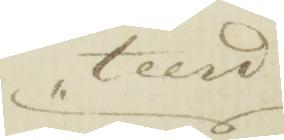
„teerd
